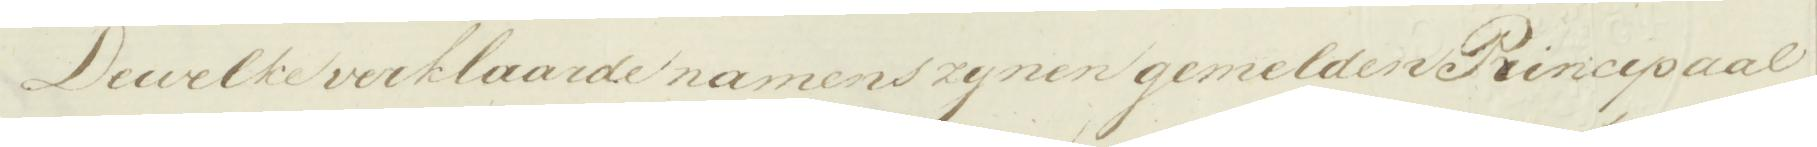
Dewelke verklaarde namens zynen gemelden Principaal
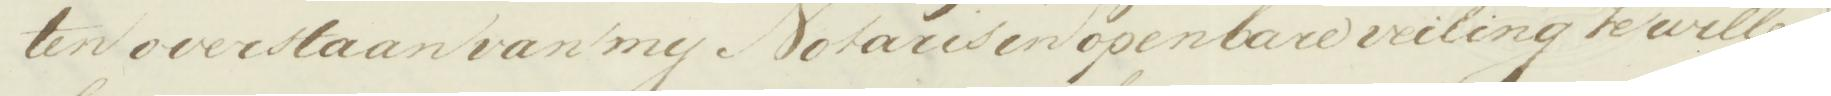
ten overstaan van my Notaris in openbare veiling te willen
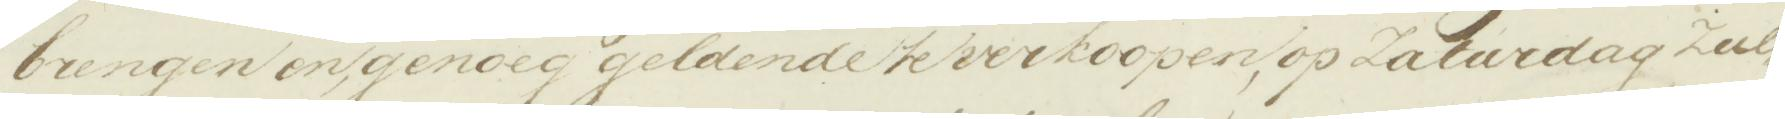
brengen en genoeg geldende te verkoopen, op zaturdag zul
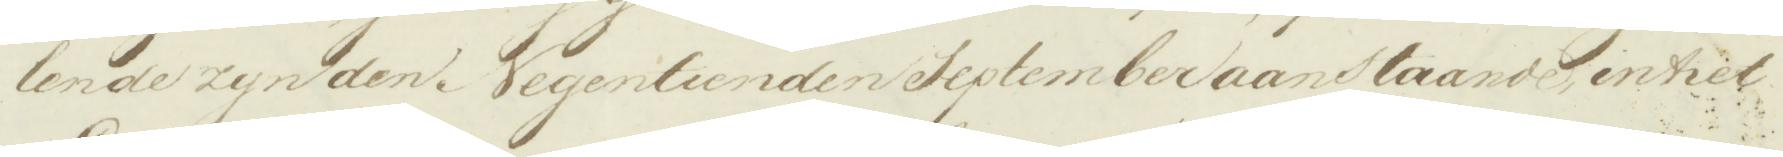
lende zyn den Negentienden September aanstaande, in het
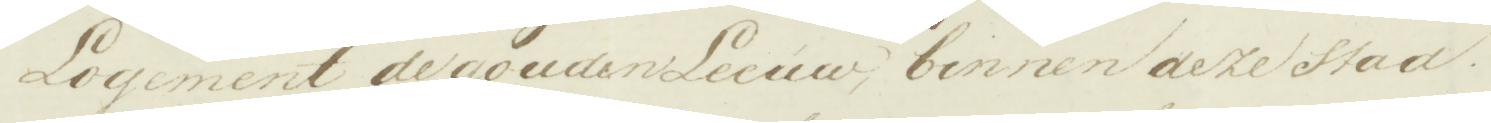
Logement de gouden Leeuw, binnen deze stad.
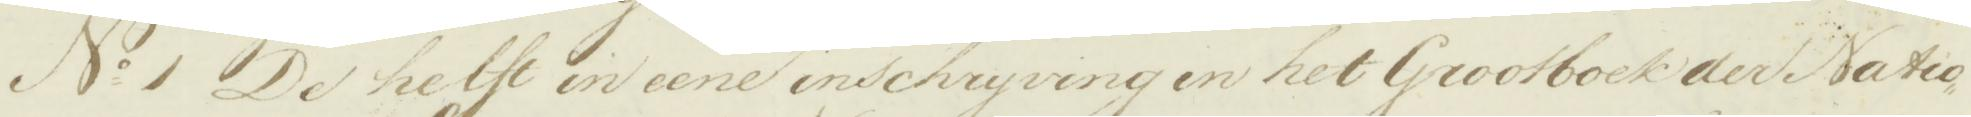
N=o 1 De helft in eene inschryving in het Grootboek der Natio„
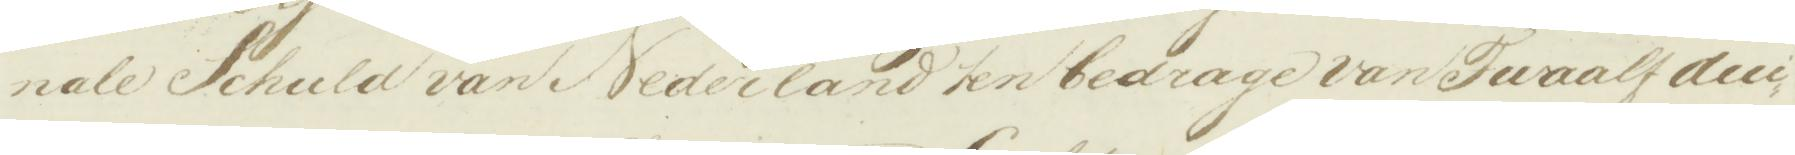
nale Schuld van Nederland ten bedrage van Twaalf dui„
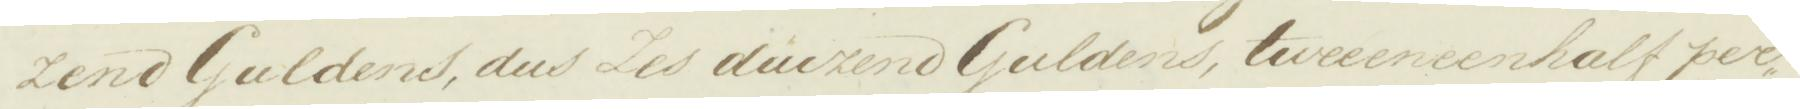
zend Guldens, dus Zes duizend Guldens, twee en een half per„
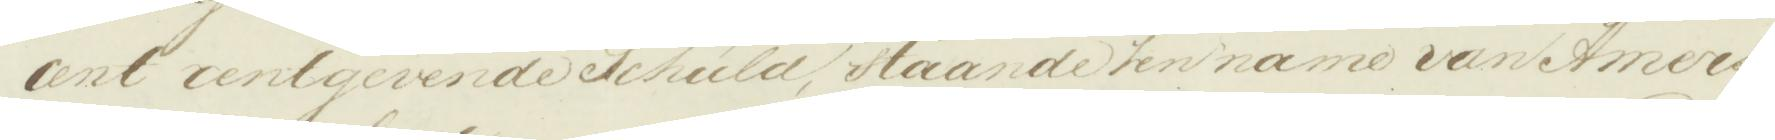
cent rentgevende schuld, staande ten name van Amers
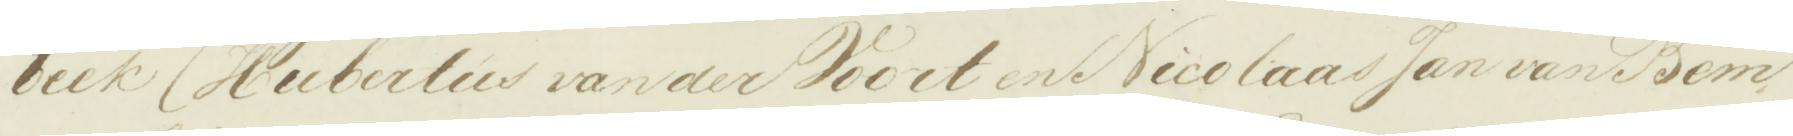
beek (Hubertus van der Voort en Nicolaas Jan van Bem,
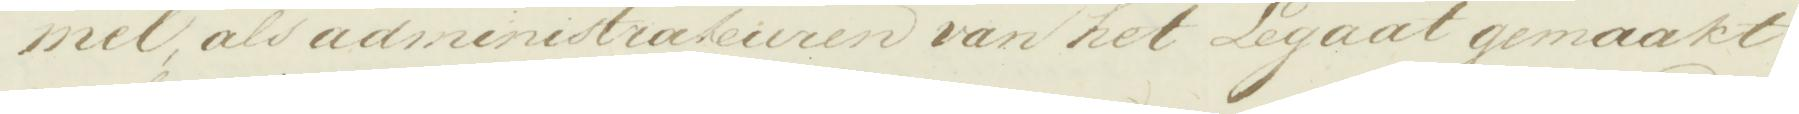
mel als administrateuren van het Legaat gemaakt
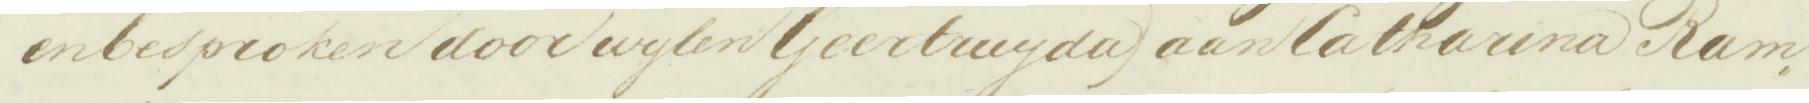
en besproken door wylen Geertruyda) aan Catharina Ram„
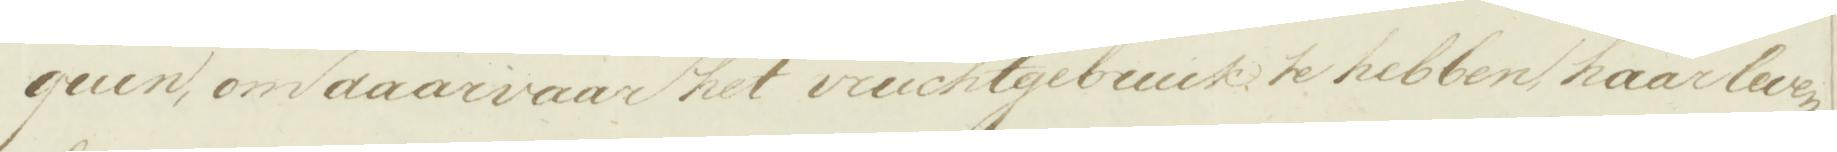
quin, om daarvaar het vruchtgebruik te hebben, haar leven
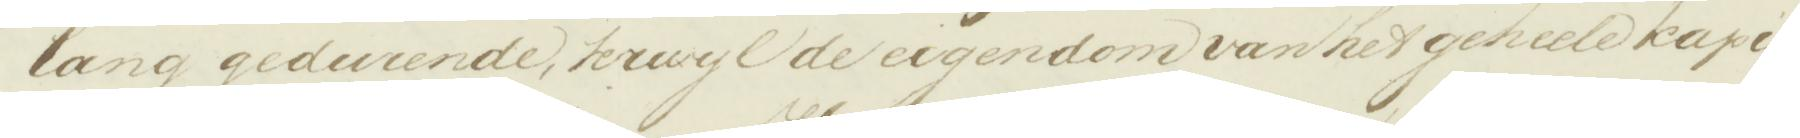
lang gedurende, terwyl de eigendom van het geheele kapi
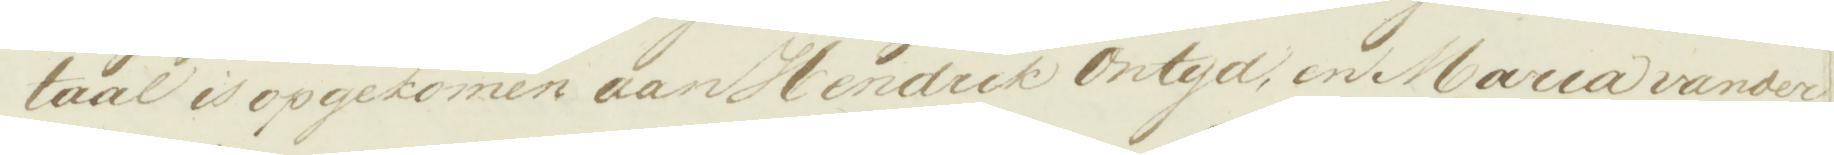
taal is opgekomen aan Hendrik Ontyd, en Maria vander
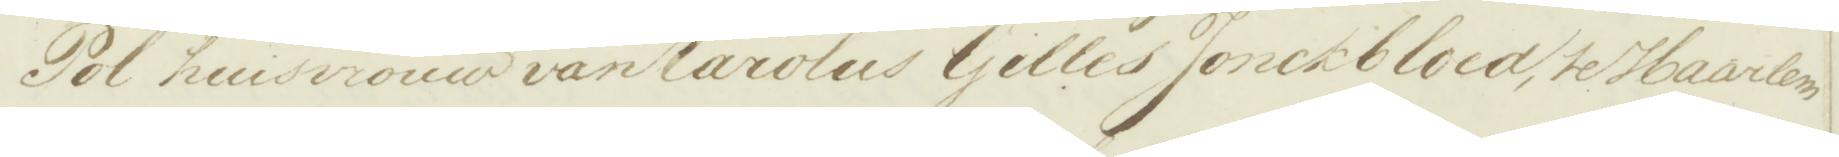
Pol huisvrouw van Carolus Gilles Jonckbloed, te Haarlem
